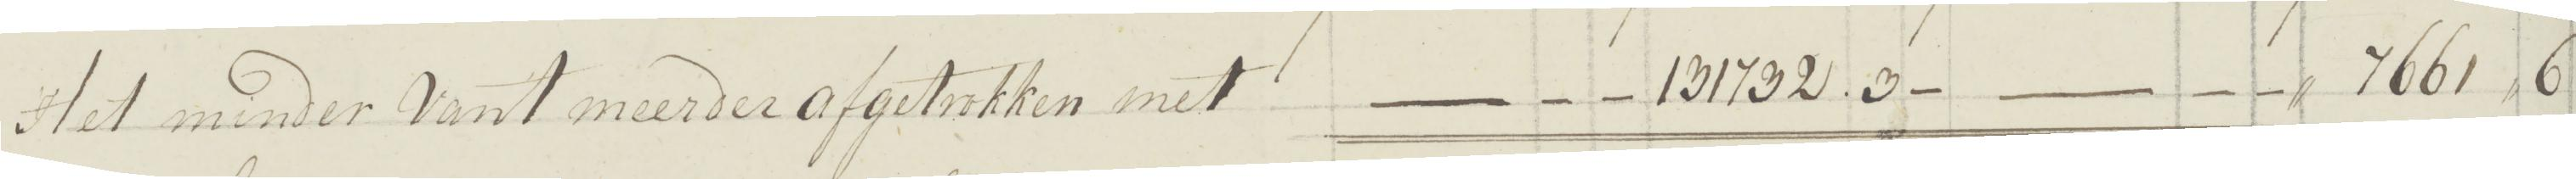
Het minder van’t meerder afgetrokken met — – – 131732. 3 – — – – „ 7661 „ 6
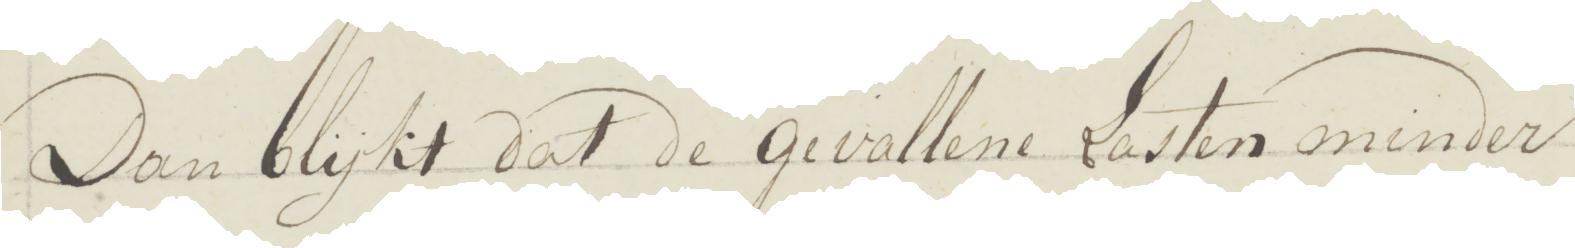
Dan blijkt dat de gevallene Lasten minder
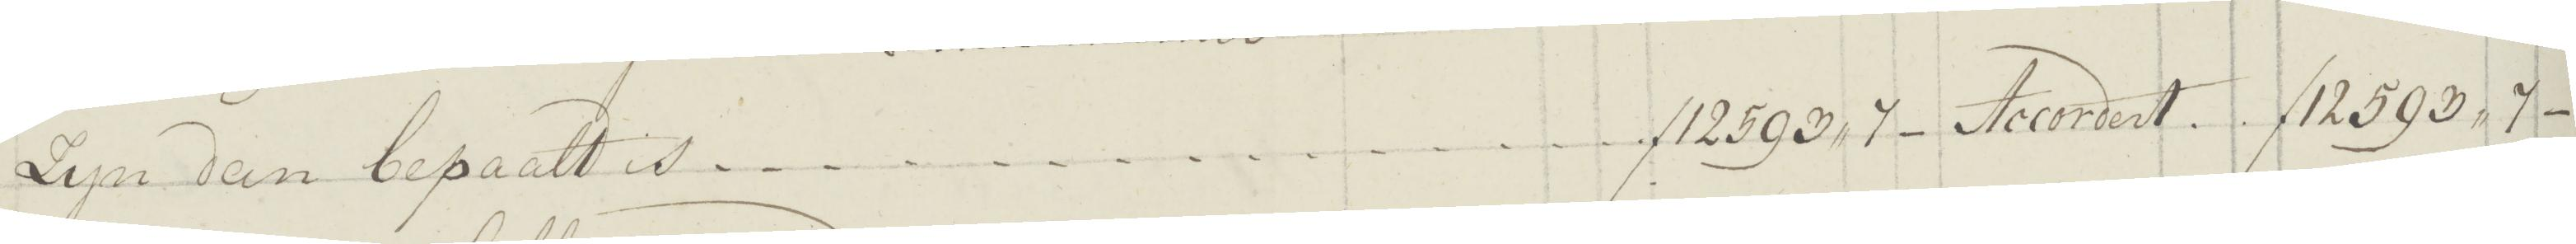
zyn dan bepaalt is - - - - - - - - - - - - - - - .ƒ 12593 „ 7 – Accordert . . ƒ12593 „ 7 –
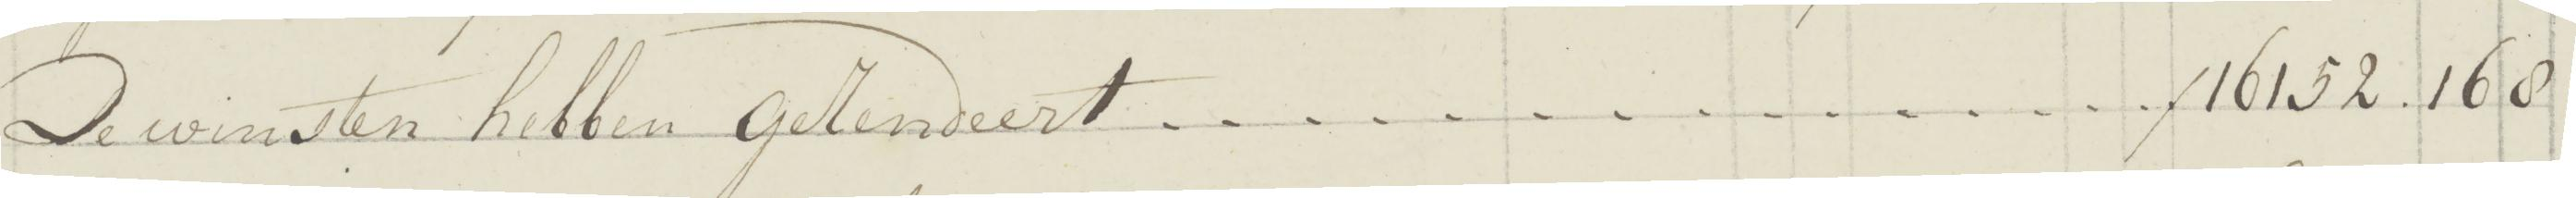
De winsten hebben gerendeert - - - - - - - - - - - - - - - ƒ16152 . 16 8
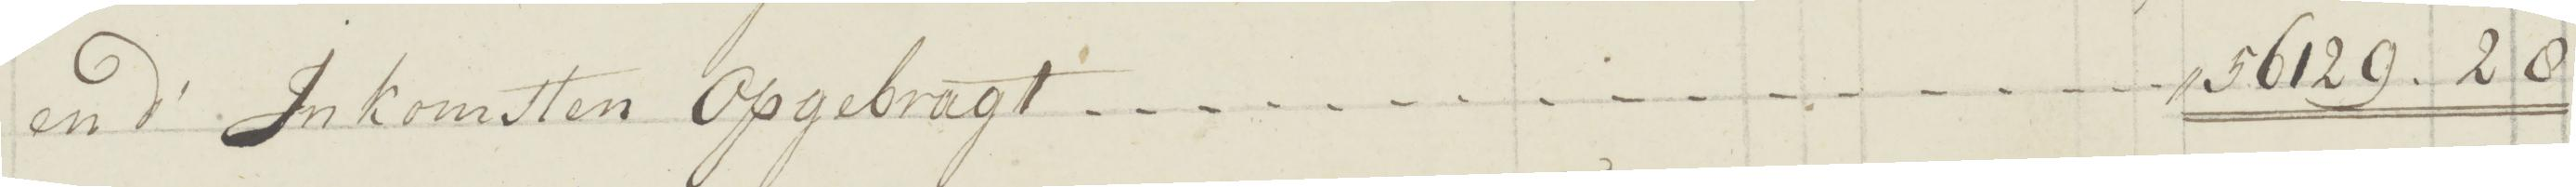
en d’ Inkomsten Opgebragt - - - - - - - - - - - - - - - - - „ 56129. 2 8
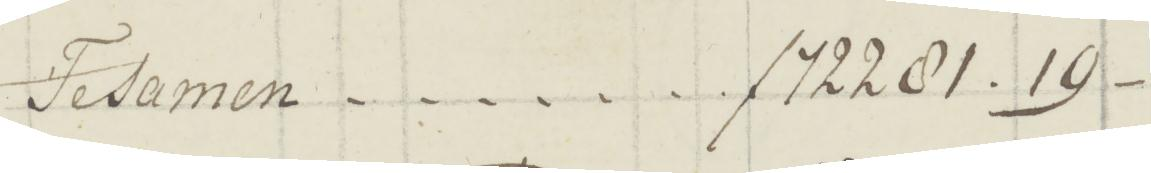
Tesamen - - - - - - . ƒ72281 . 19 –
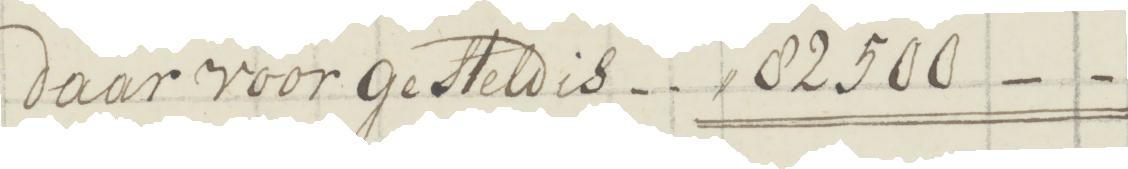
daar voor gesteld is - - „ 82500 – –
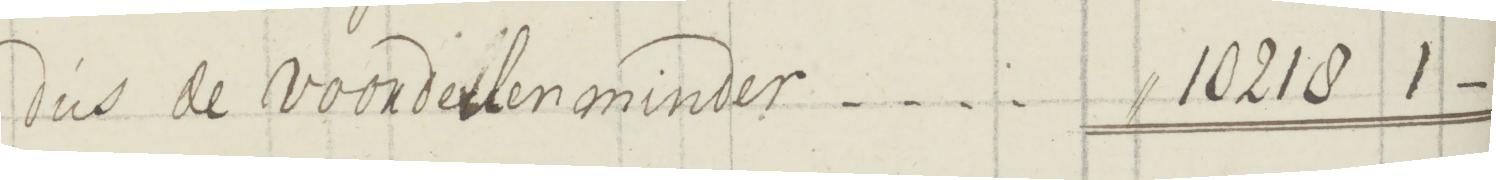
dus de voordeelen minder - - - - „ 10218 1 –
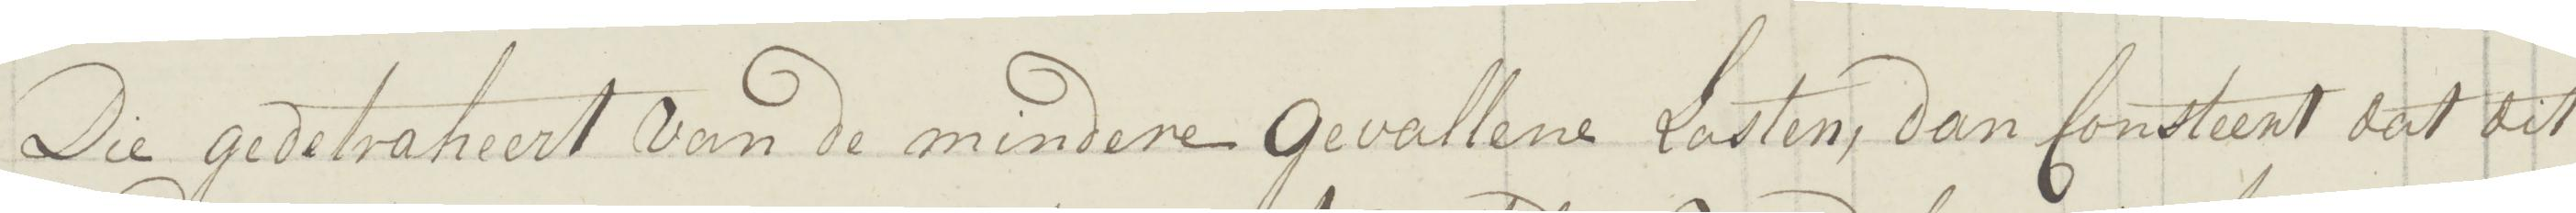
Die gedetraheert van de mindere gevallene Lasten, dan Consteert dat dit
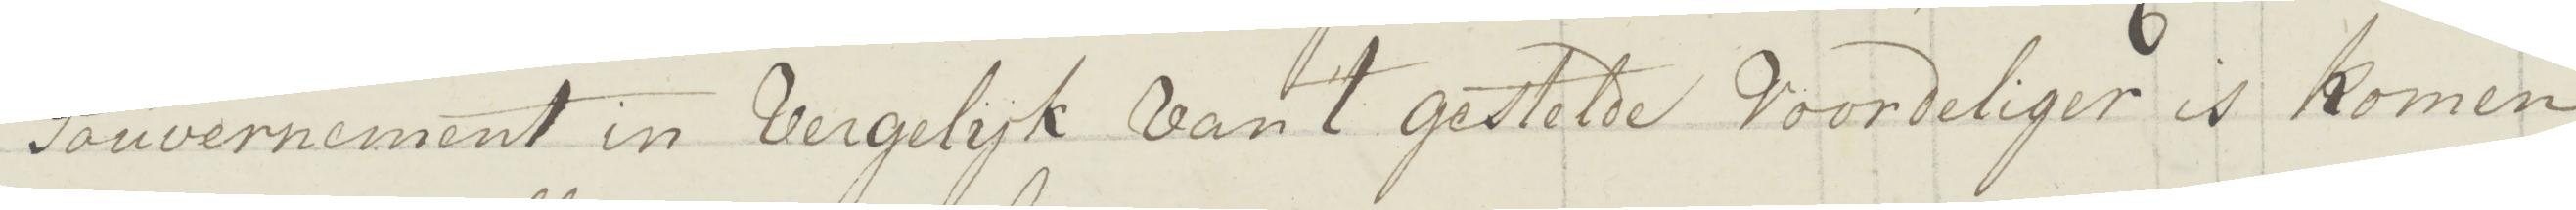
Gouvernement in vergelijk van ’t gestelde voordeliger is komen
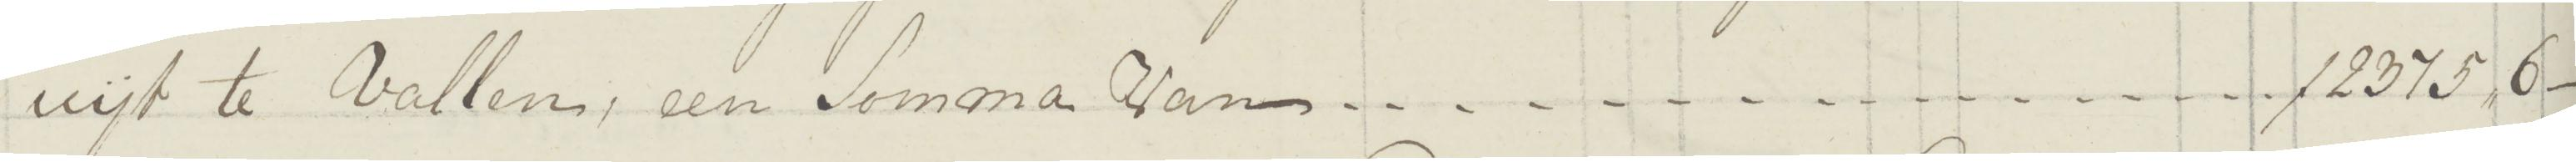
uijt te vallen; een somma van - - - - - - - - - - - - - - - - - ƒ2375 „ 6 –
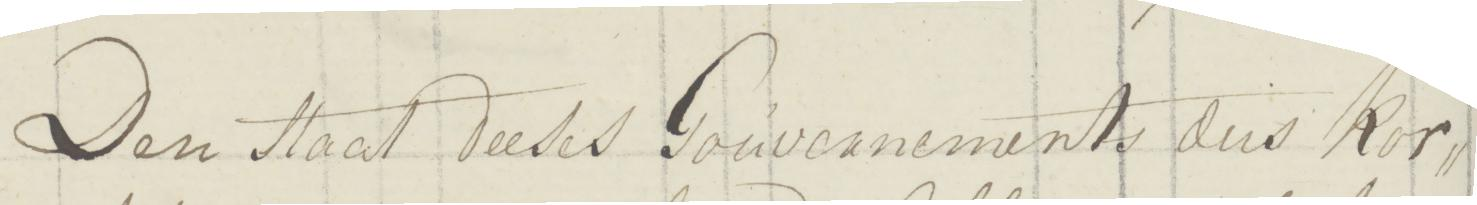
Den staat deeses Gouvernement dus kor„
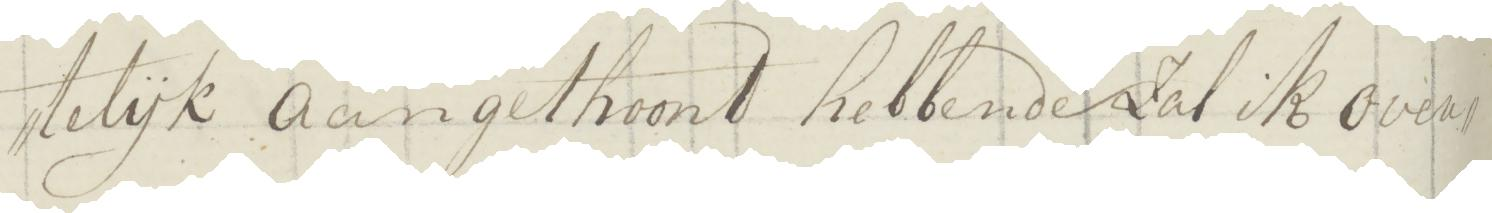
„telijk aangethoont hebbende zal ik over„
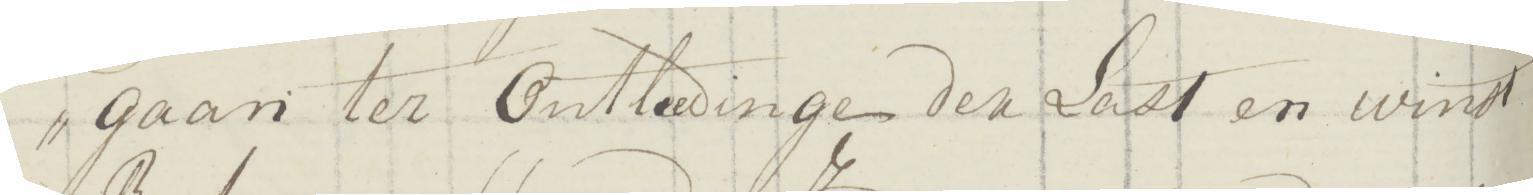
„gaan ter Ontleedinge der Last en windt
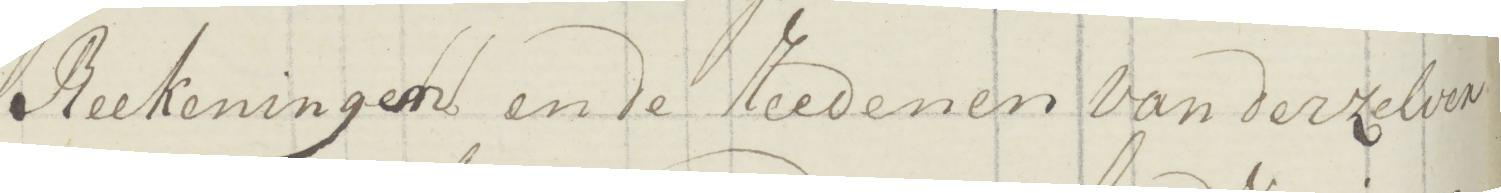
Reekeningen en de reedenen van derzelven
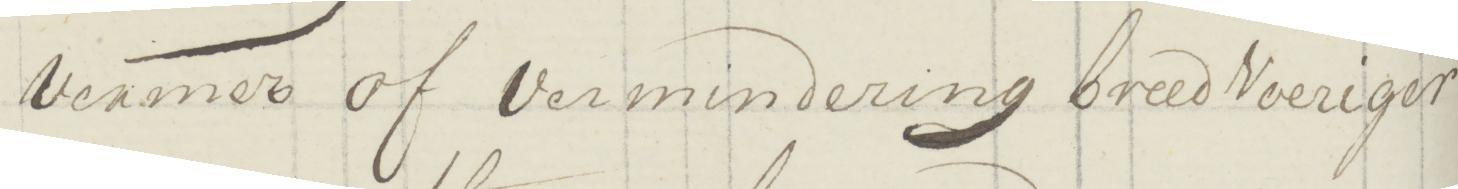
vermer of vermindering breed voeriger
